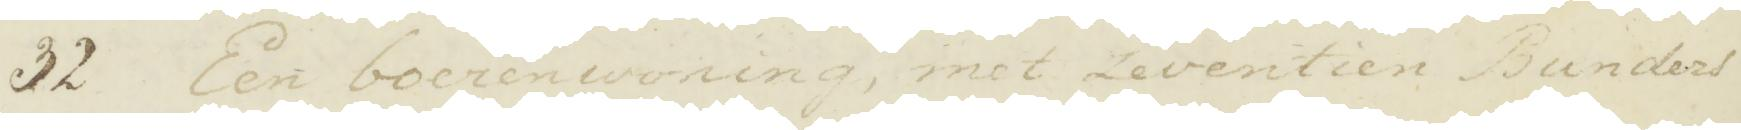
32 Een boerenwoning, met zeventien Bunders
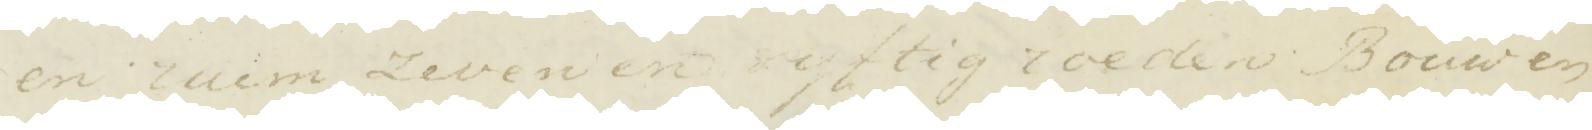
en ruim zeven en vyftig roeden Bouw en
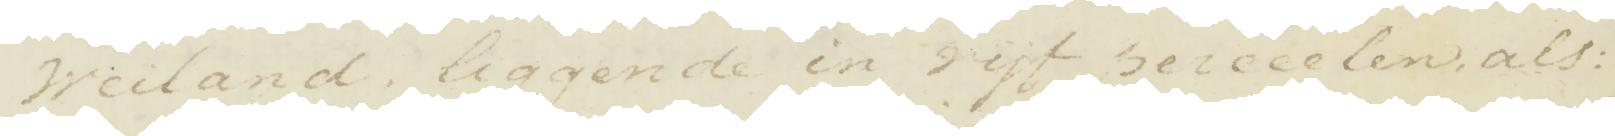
Weiland, liggende in vyf perceelen, als:
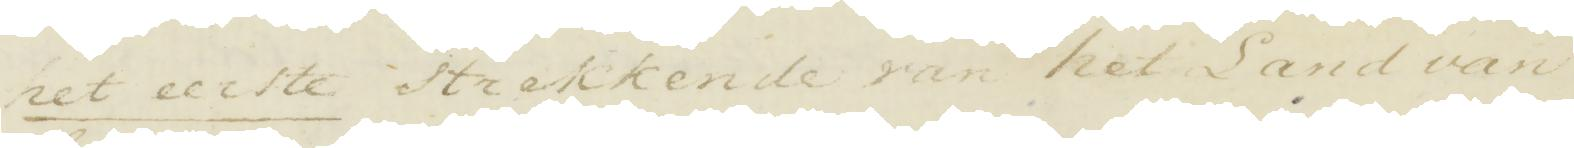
het eerste strekkende van het Land van
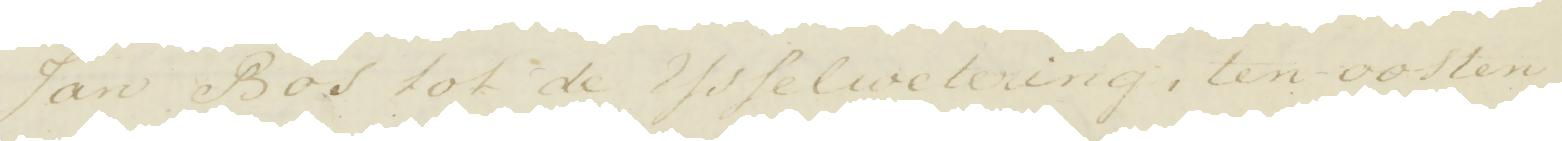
Jan Bos tot de Ysselweteing, ten oosten
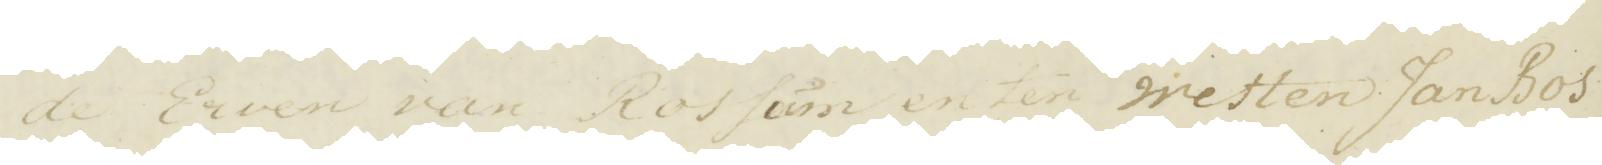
de Erven van Rossum en ten westen Jan Bos
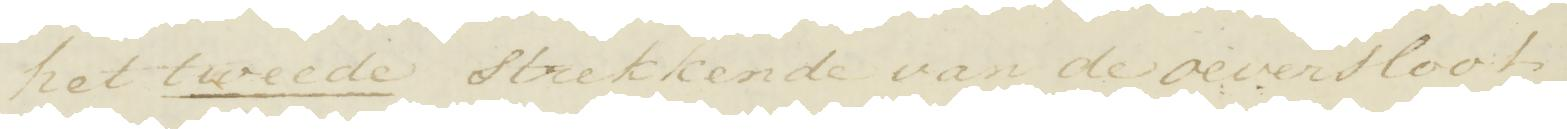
het tweede strekkende van de oeversloot
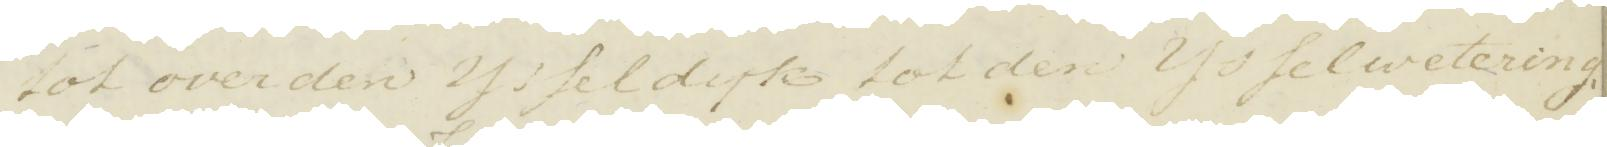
tot over den Ysseldyk tot den Ysselwetering
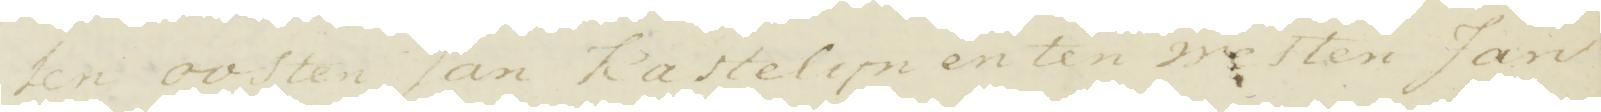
ten oosten Jan Kastelyn en ten westen Jan
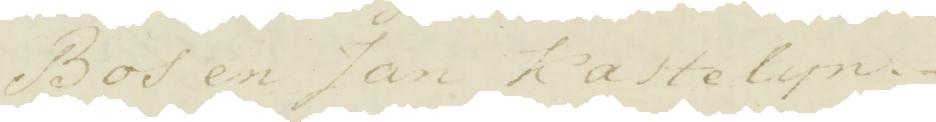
Bos en Jan Kastelyn.
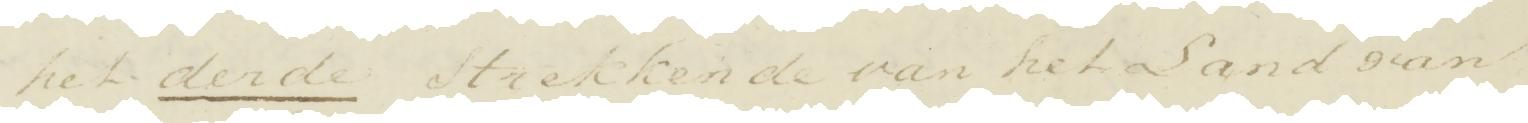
het derde strekkende van het Land van
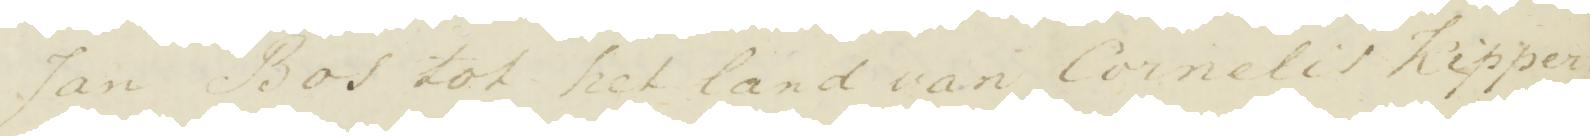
Jan Bos tot het land van Cornelis Kipper
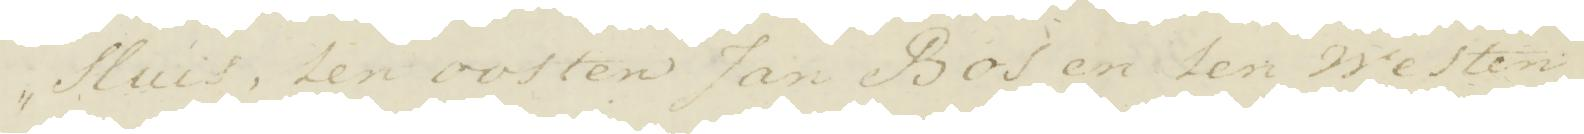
„sluis, ten oosten Jan Bos en ten westen
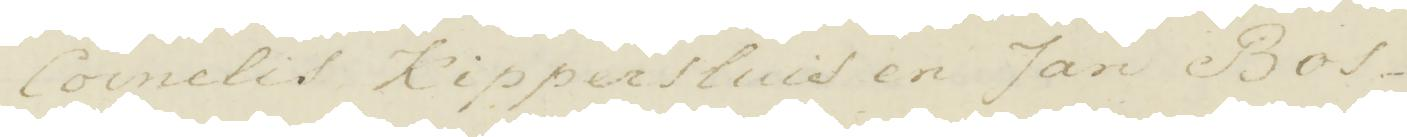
Cornelis Kippersluis en Jan Bos.
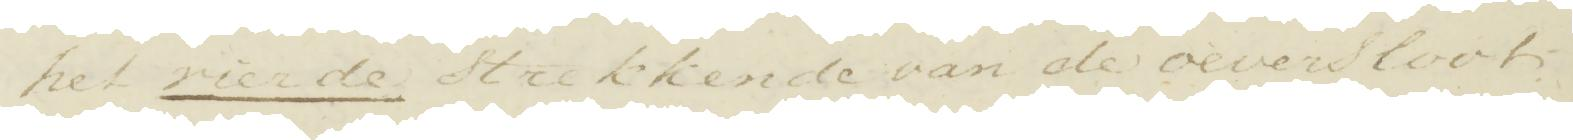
het vierde strekkende van de oeversloot
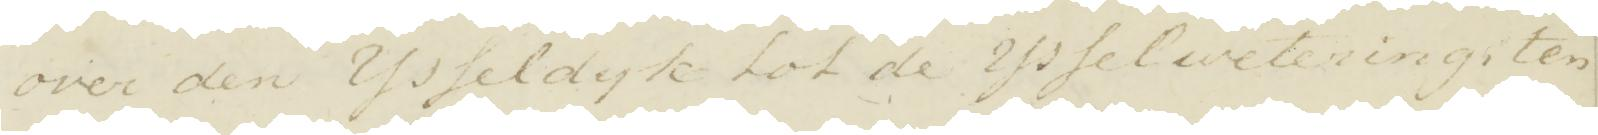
over den Ysseldyk tot de Ysselwetering, ten
